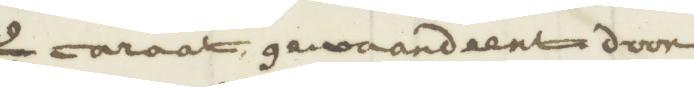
caraat, gewaardeert door
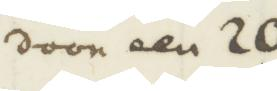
door een 20
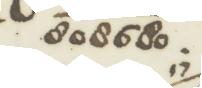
616219/808680.
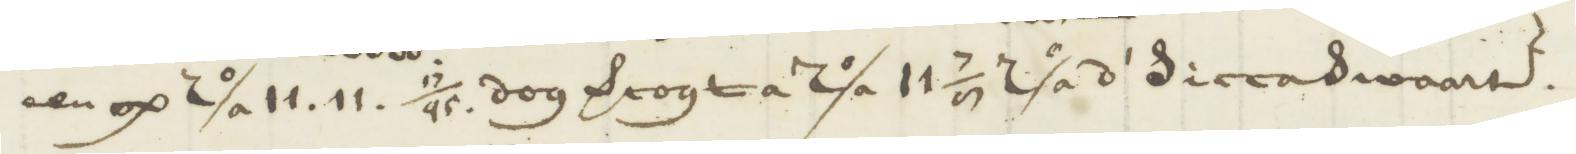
een op ro/a 11.11. 12/45. dog vercogt a 2 ro/a 11 7/8 ro/a d’ siccaswaarte.
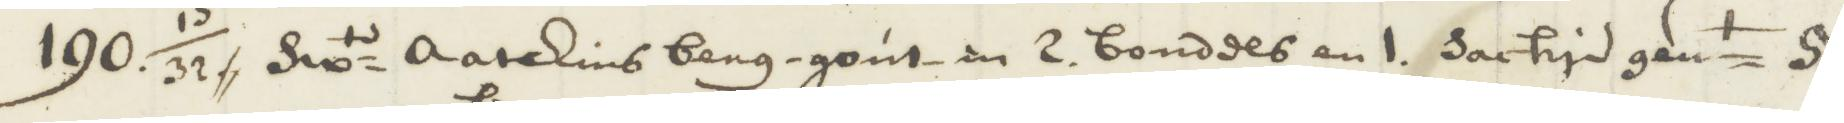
190. 15/32„ sw=te aatchins berg-gout en 2. bondels en 1. sackje gen=t 5.
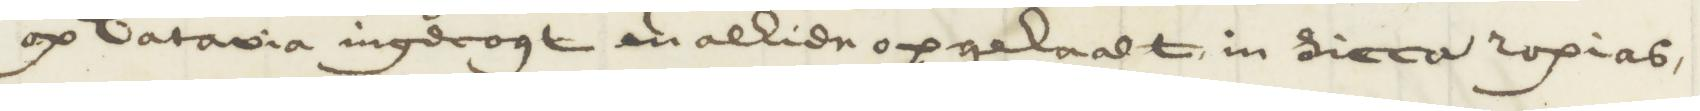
op batavia ingecogt en alhier opgehaalt, in sicca ropias,
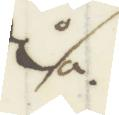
ro/a
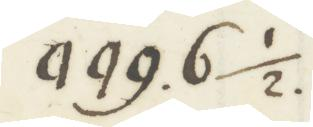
449.6½.
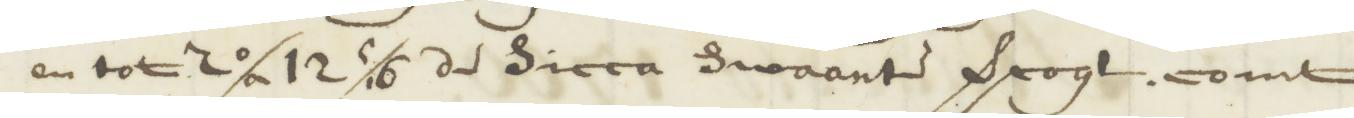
en tot ro/a 12 5/16 de sicca swaarte vercogt. comt
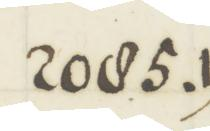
2085.
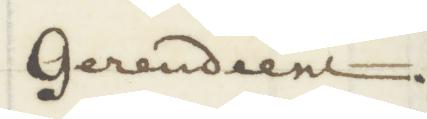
Gerendeert.
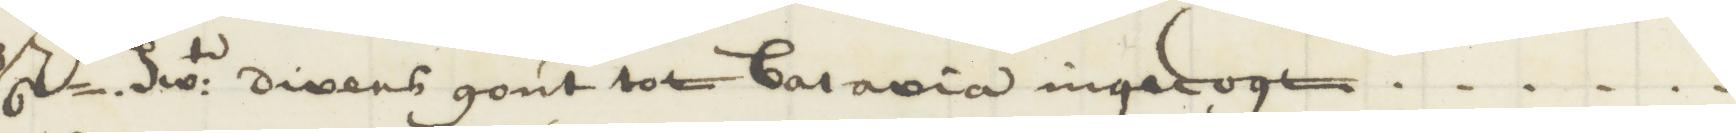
D=. Sw:te divers gout tot batavia ingecogt . - . - . -
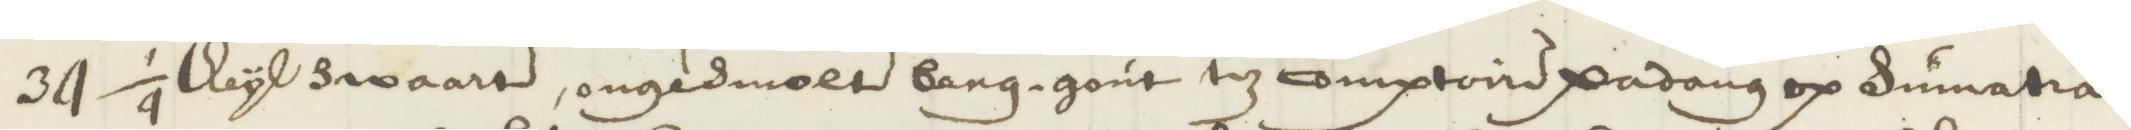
34¼ theijl swaarte, ongesmolte barg-gout ten comptoire padang op Sumatras
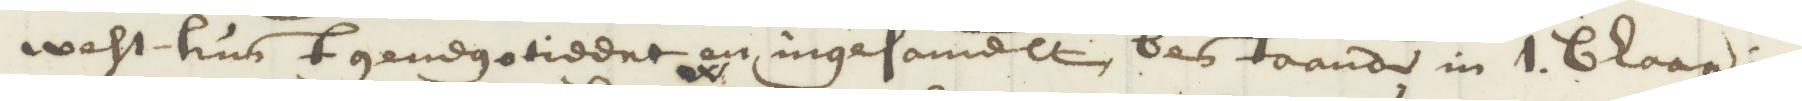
west-kust genegotieert en ingesamelt, bestaande in 1. bhaar in
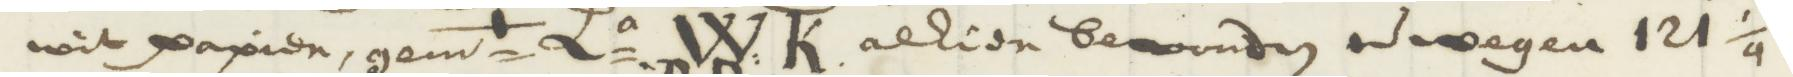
wit papier, gem=t L=o P.D.W:W:K. alhier bevonden te wegen 121¼
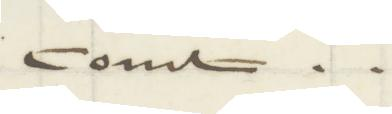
comt..
